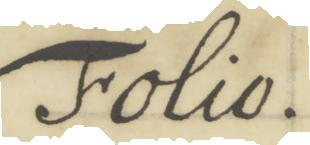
Folio.
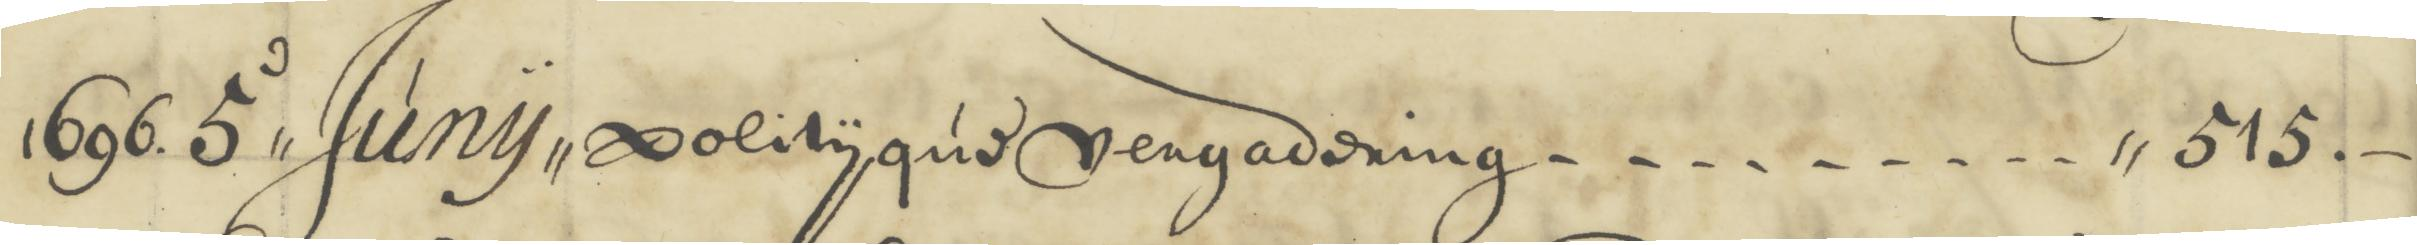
1696. 5„e Junij„ politijque vergadering - - - - - - - - - „ 515.—
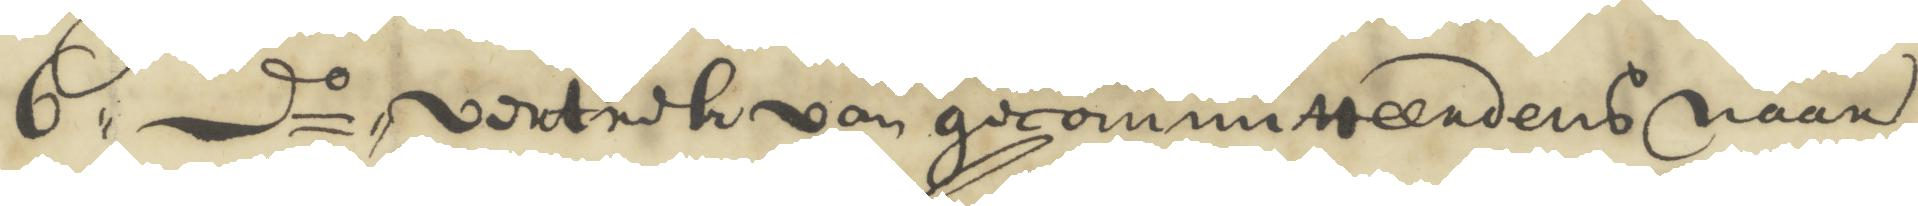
6„ d=o„ vertrek van gecommitteerdens naar
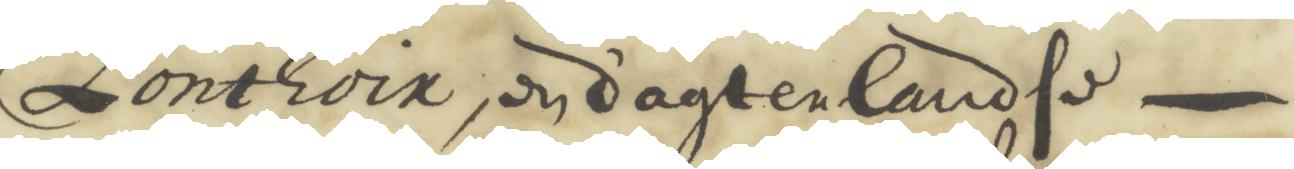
Lonthoir, en d'agterlandse —
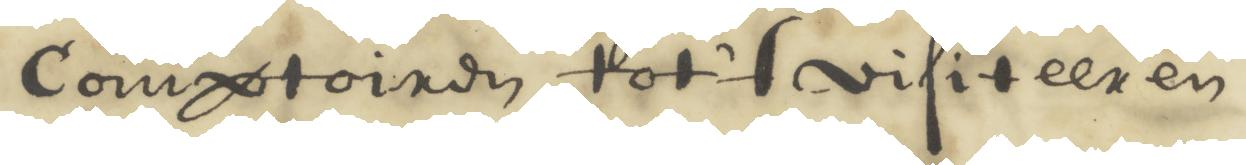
Comptoiren, tot ’t visiteeren
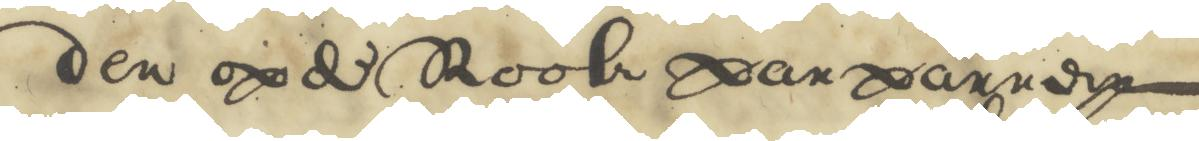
den op de Rook parparren
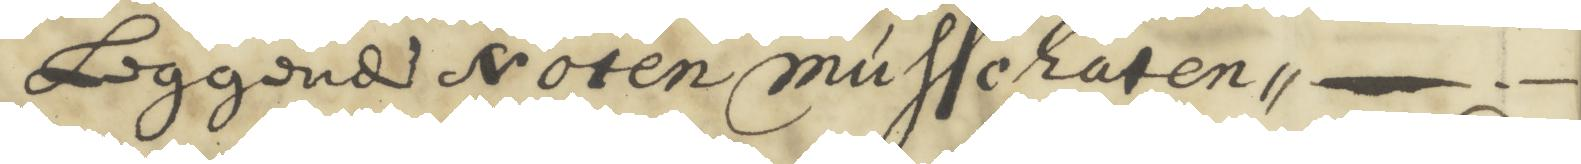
leggende Noten musschaten „ —. —
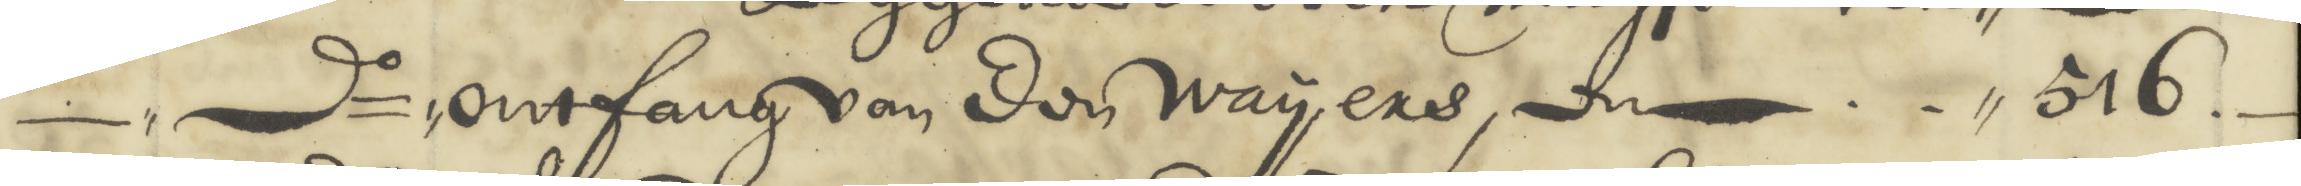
— „ d=o „ ontfang van Een waijers, en - - „ 516. —
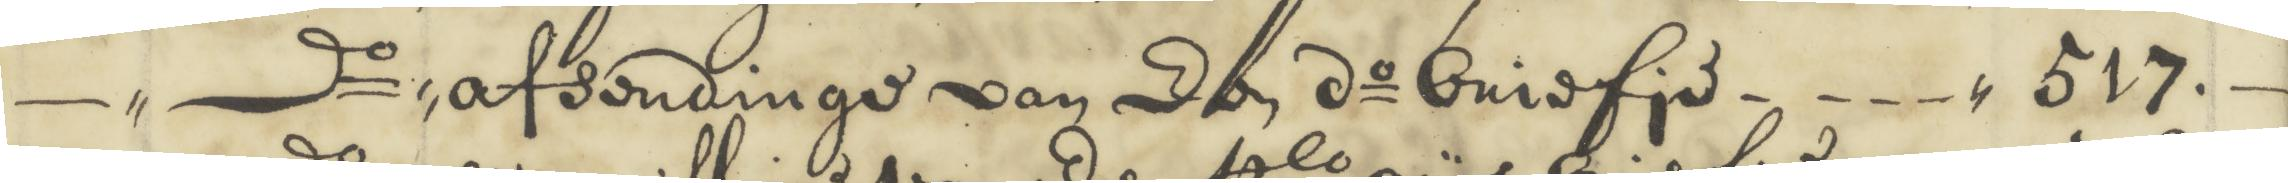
— „ d=o „ afsendinge van Een d=o briefje - - - - „ 517. —
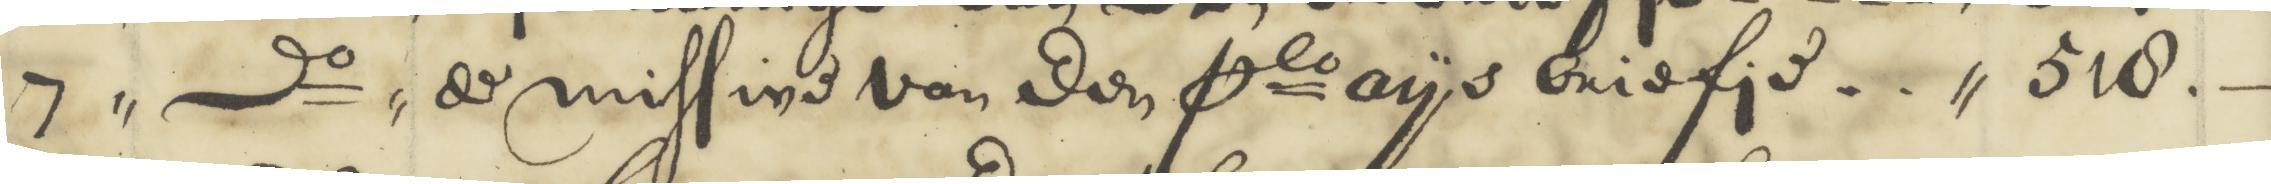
7 „ d=o „ de missive van Een p=lo aijs briefje - - „ 518. —
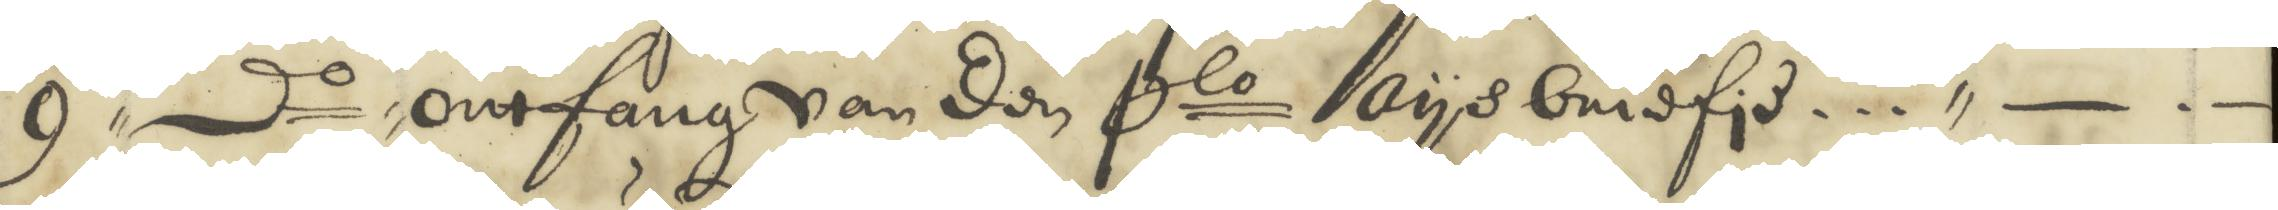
9 „ d=o „ ontfang van Een p=lo aijs briefje - - - „ —. —
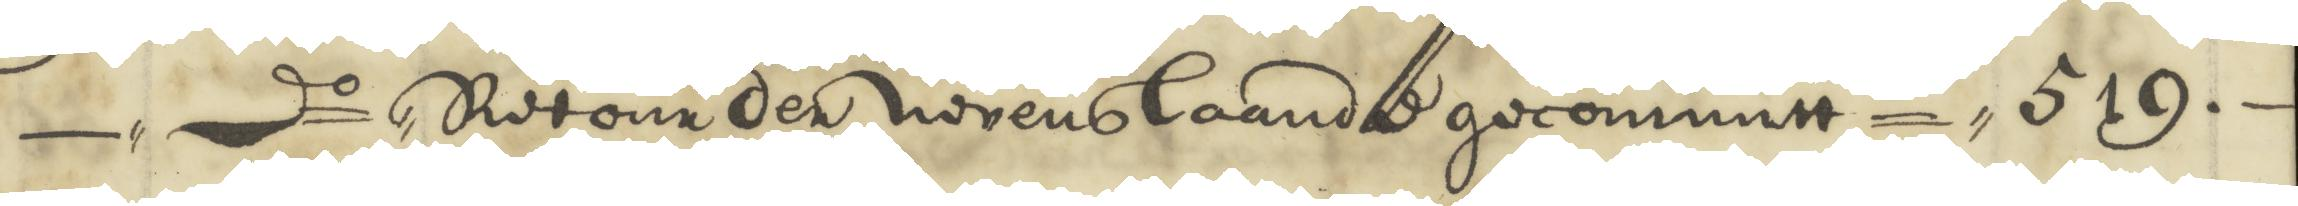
— „ d=o „ Retour der nevenstaande gecommitt=s „ 519. —
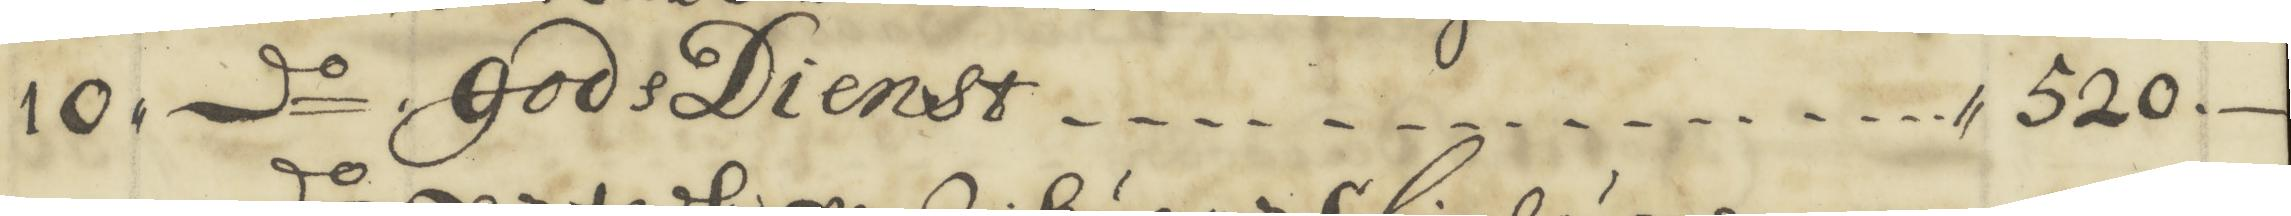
10 „ d=o „ gods Dienst - - - - - - - - - - - - - - - - „ 520.—
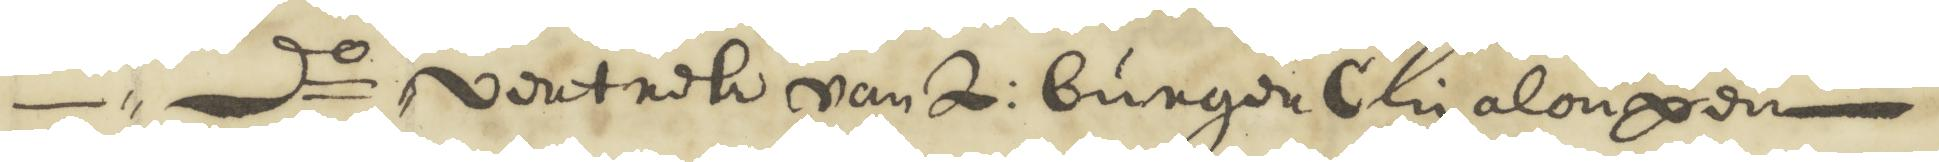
— „ d=o „ vertrek van 2: burger Chialoupen
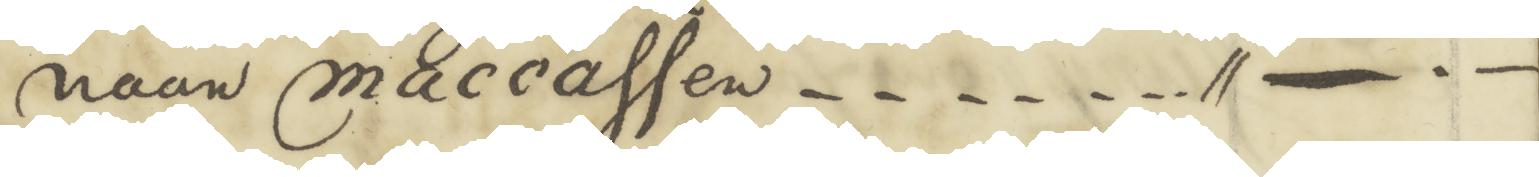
naar maccasser - - - - - - „ —.—
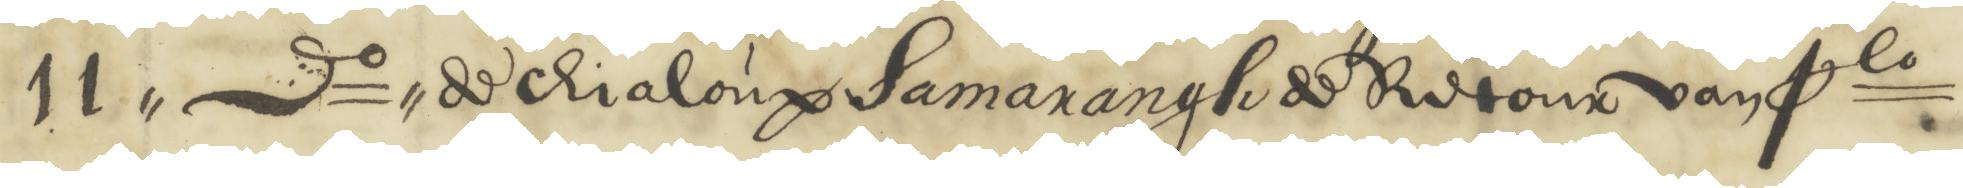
11 „ d=o „ de chialoup Samarangh de Retour van p=lo
